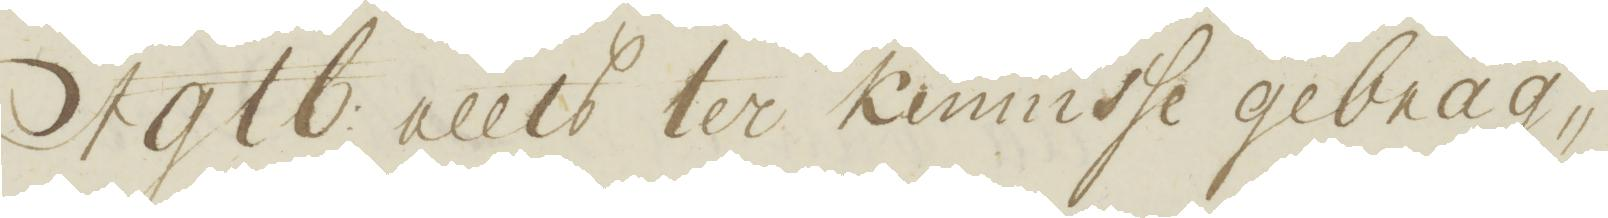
Agtb: reets ter kennisse gebrag„
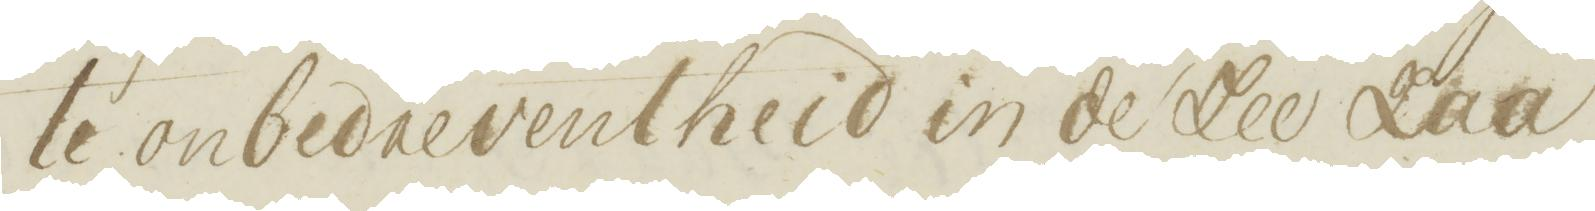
te onbedreventheid in de zee zaa
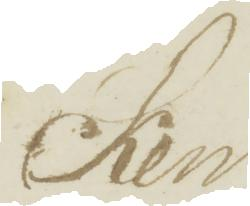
cken
